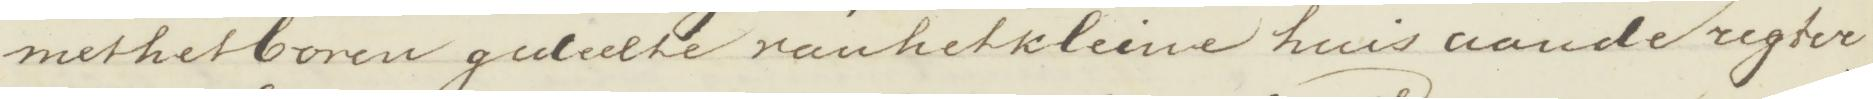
met het boven gedeelte van het kleine huis aan de regter
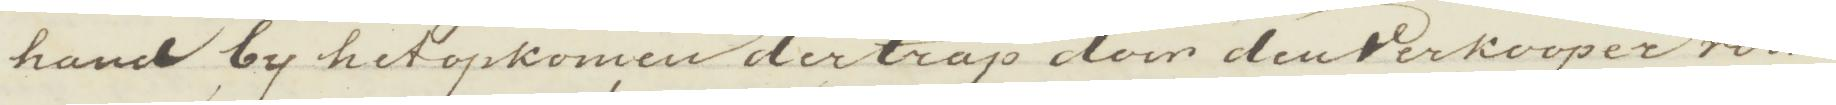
hand by het opkomen der trap door den verkooper voor
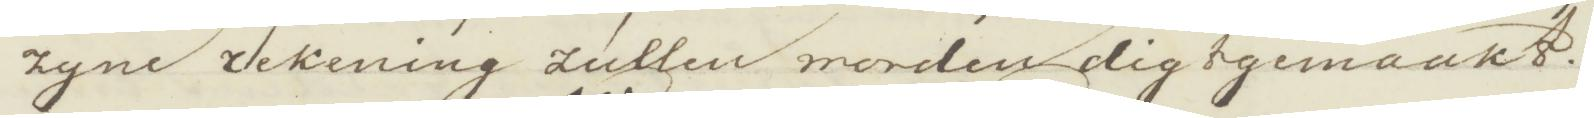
zyne rekening zullen worden digt gemaakt.
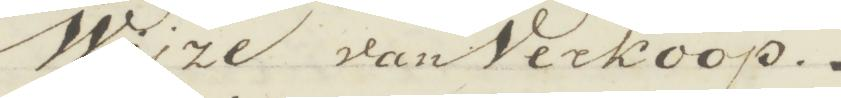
Wijze van Verkoop.
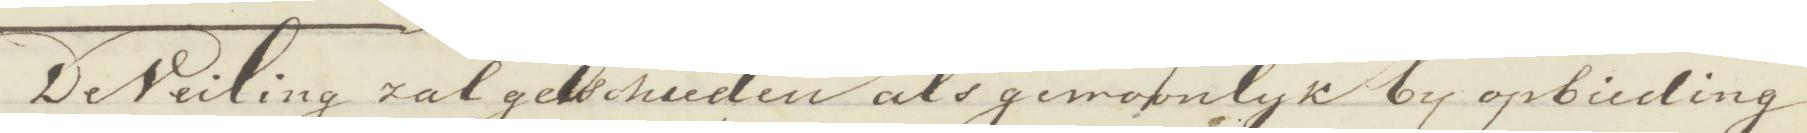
De Veiling zal geschieden als gewoonlyk by opbieding
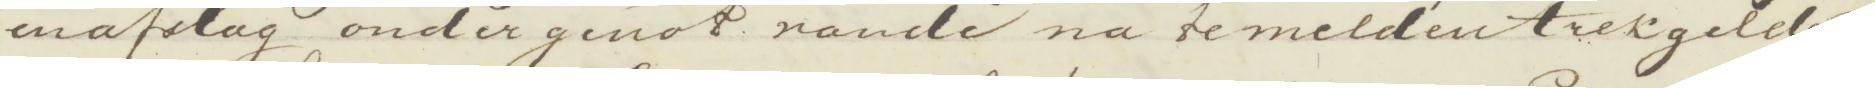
en afslag onder genot van de na te melden trekgelden
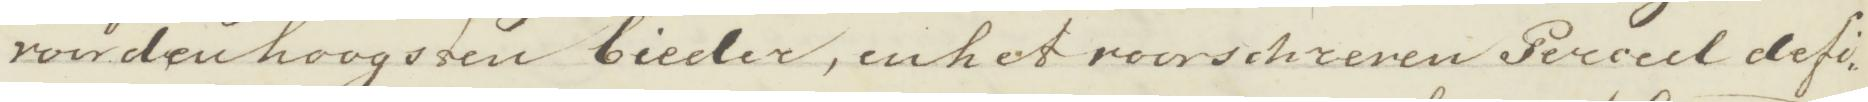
voor den hoogsten bieder, en het voorschreven Perceel defi„
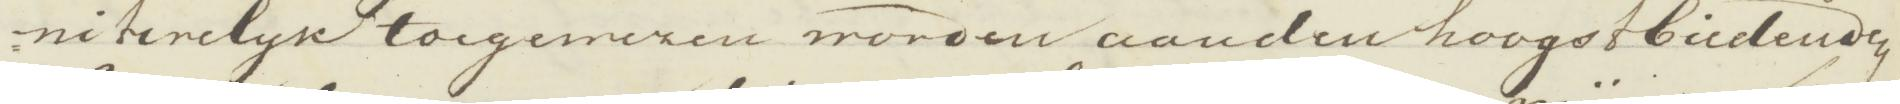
„nitivelyk toegewezen worden aan den hoogst biedenden
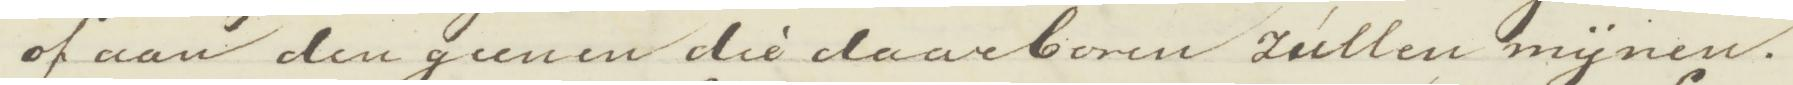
of aan den geenen die daar boven zullen mijnen.
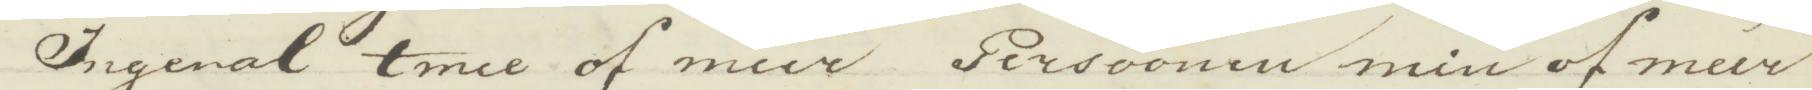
In geval twee of meer Persoonen min of meer
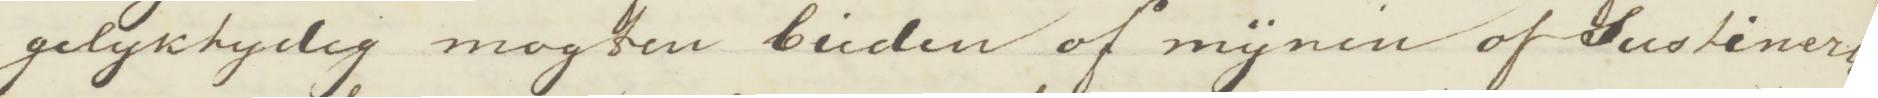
gelyktydig mogten beiden of mijnen of Sustineren
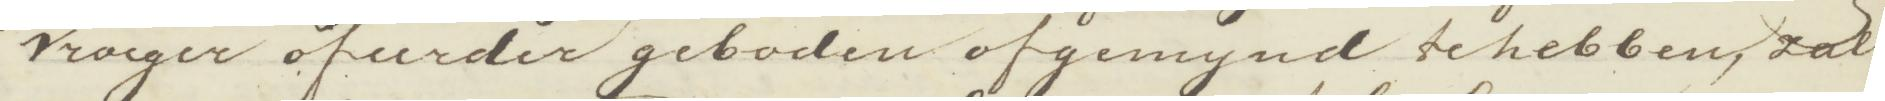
vroeger of eerder geboden of gemynd te hebben, zal
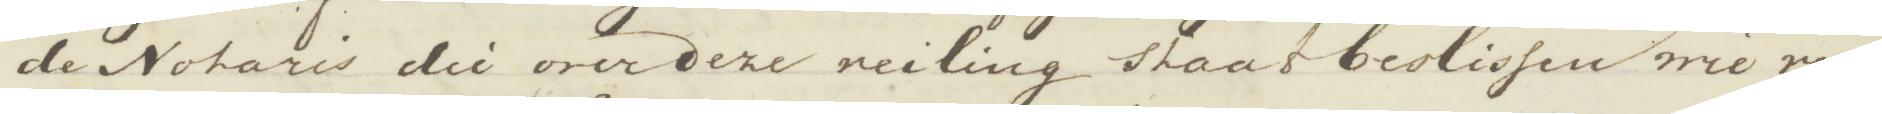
de Notaris die over deze veiling staat beslissen wie voor
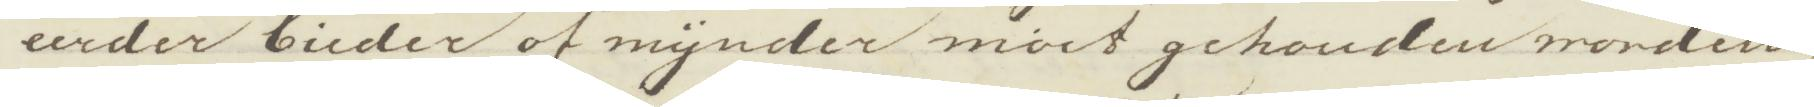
eerder bieder of mijnder moet gehouden worden
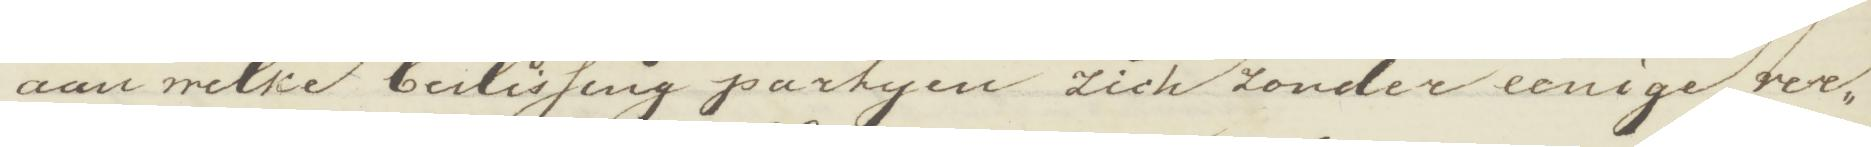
aan welke beslissing partyen zich zonder eenige ver„
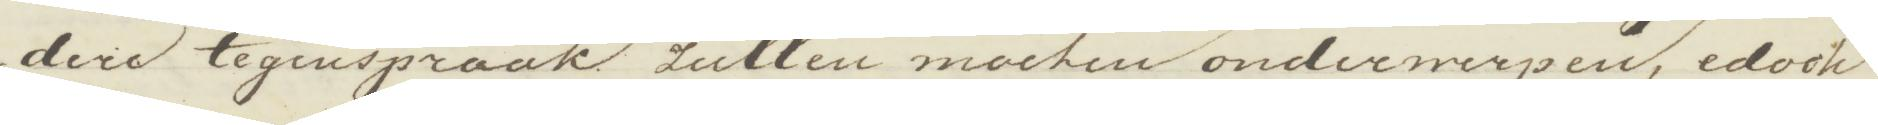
dere tegenspraak zullen moeten onderwerpen, edoch
